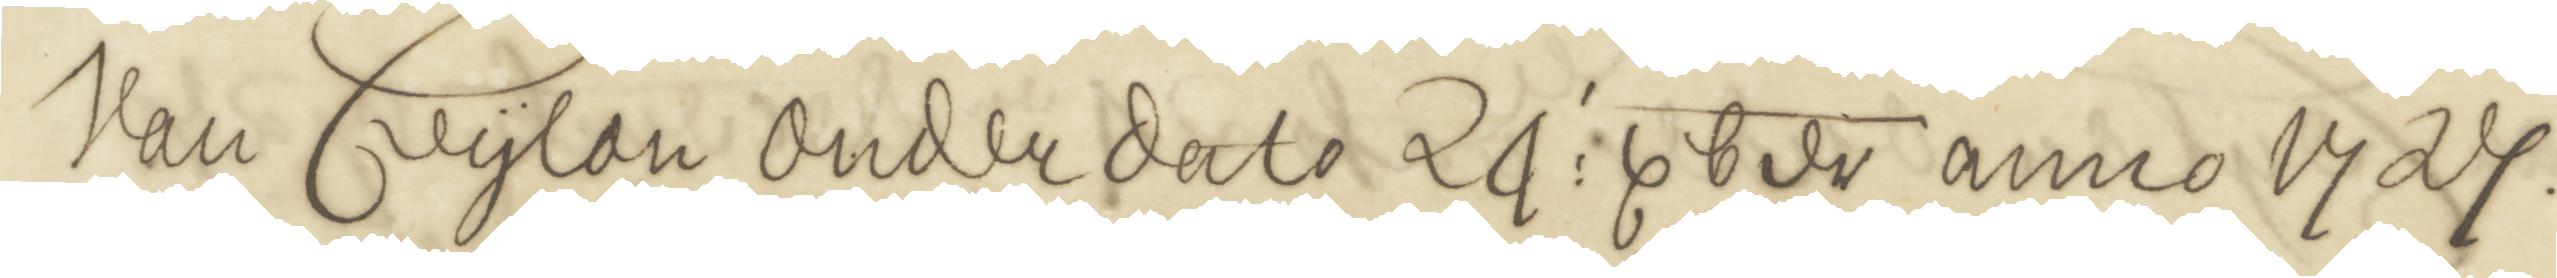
Van Ceijlon onder dato 24:' xber anno 1727.
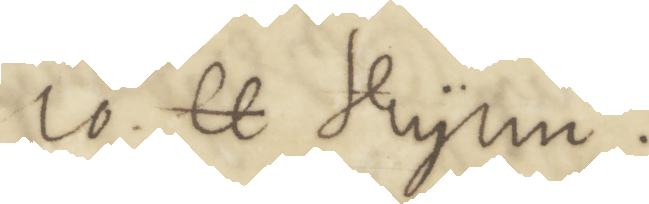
10. lb thijmi.
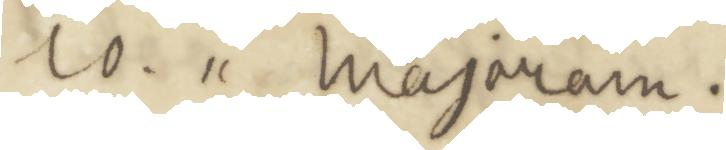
10. „ majoram.
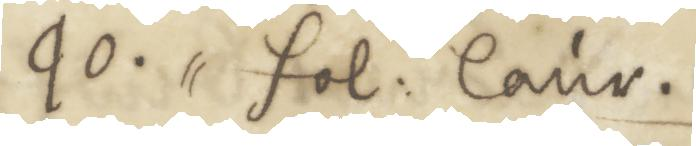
40. „ fol: Caur.
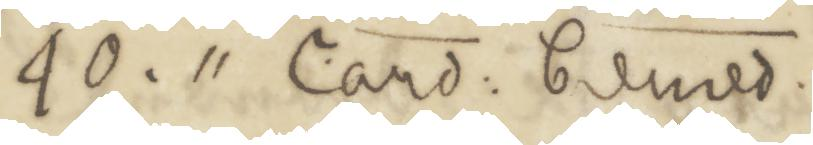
40. „ Card: bemed.
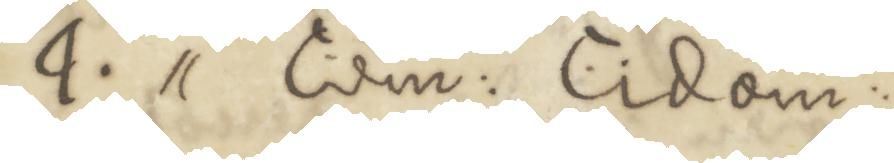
4. „ Cem: Cidom:
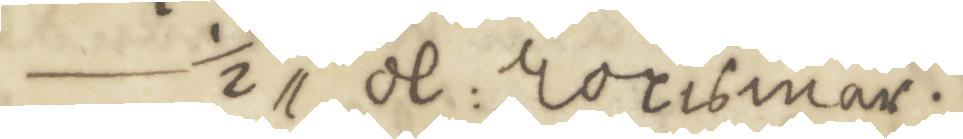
— ½ „ el: rorismar.
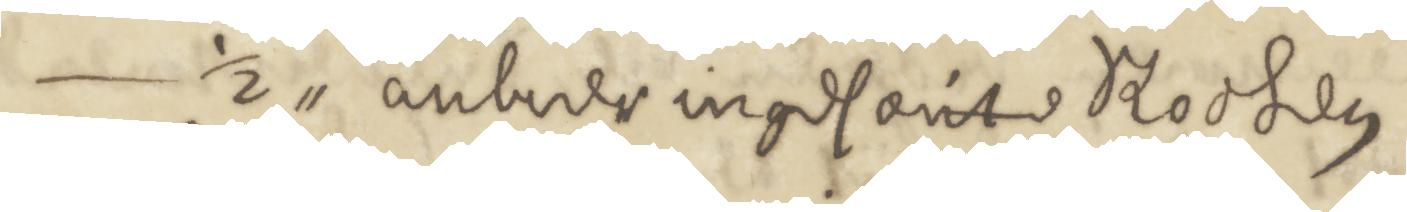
— ½ „ anker ingesoute Roosen
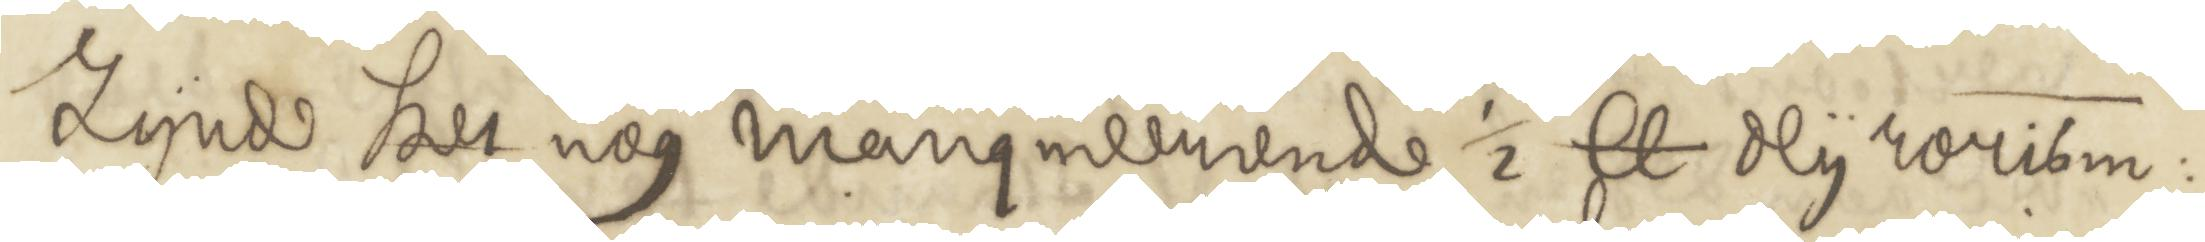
zijnde het nog manqueerende ½ lb olij rorism:
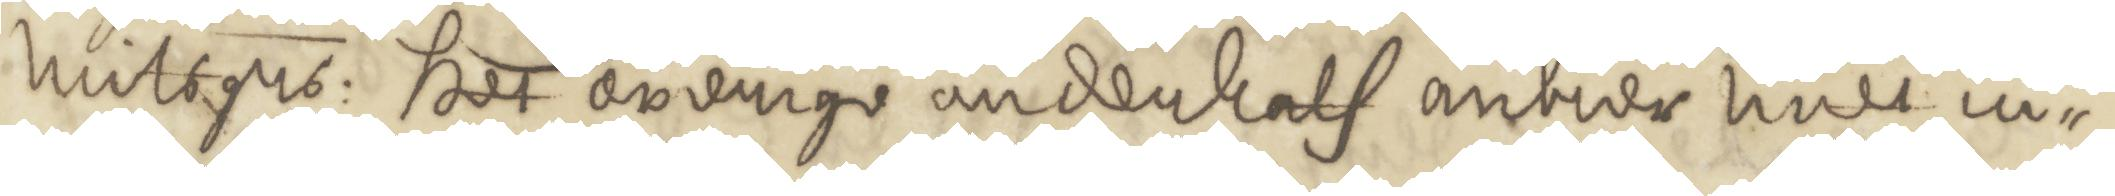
mitsgrs: het overige anderhalf anker niet in„
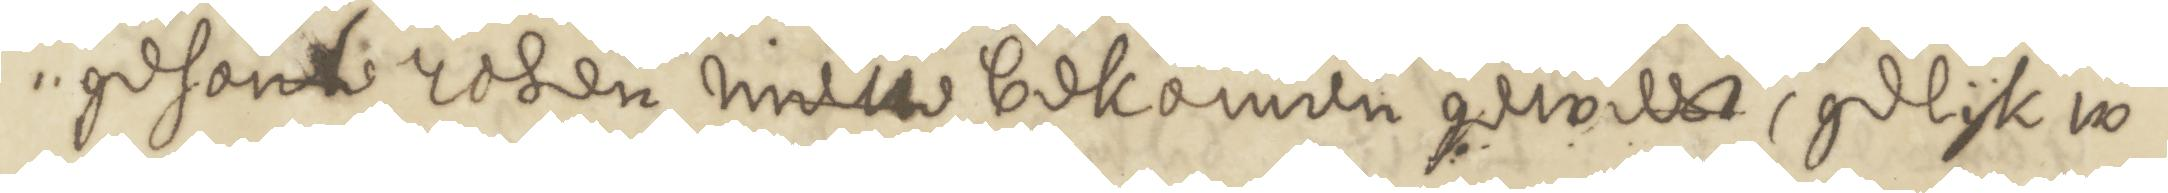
„gesoute resen niet te bekomen geweest, gelijk w'
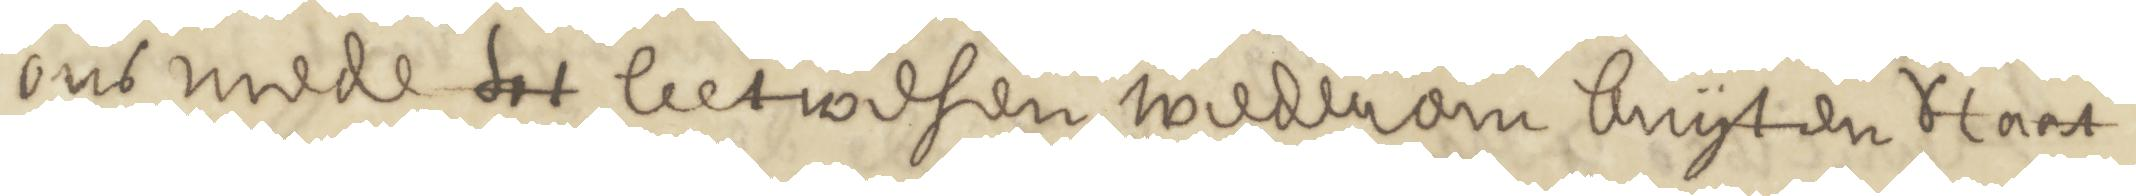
ons mede tot leetwesen wederom buijten staat
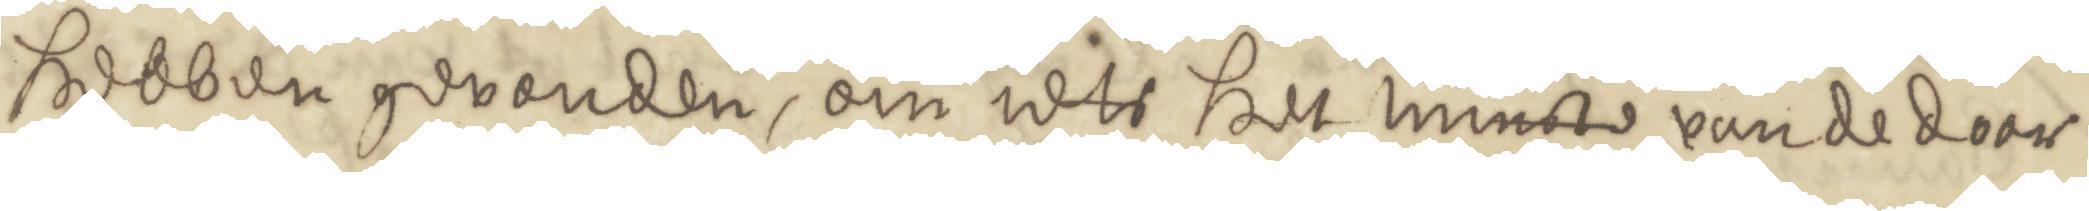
hebben gevonden, om iets het minste van de door
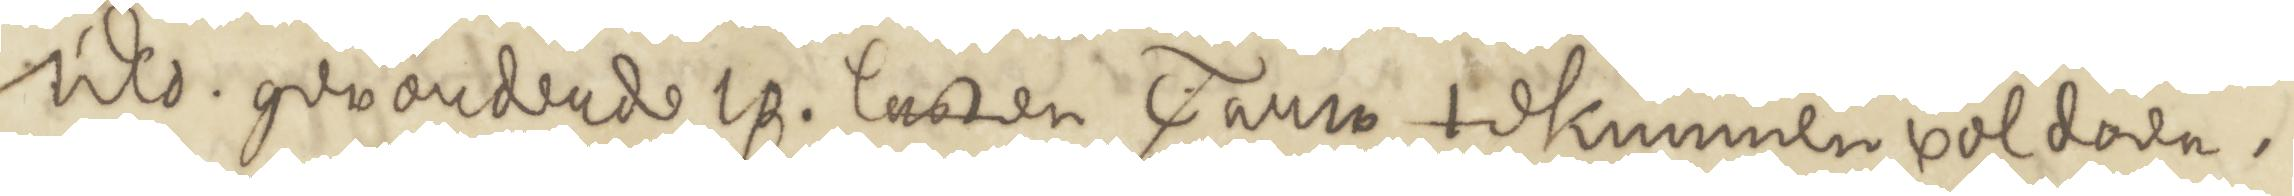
UEd. gevorderde 13. lasten Tarw te kunnen voldoen,
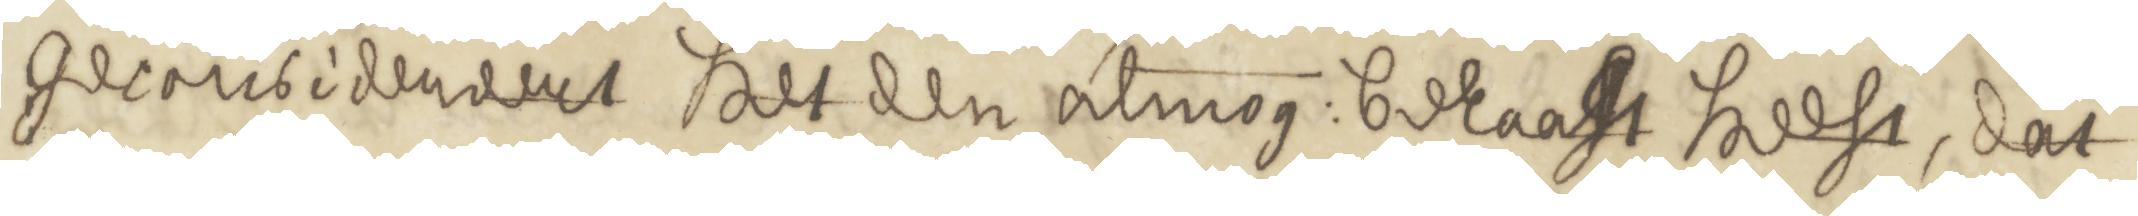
geconsidereert het den almog: behaagt heeft, dat
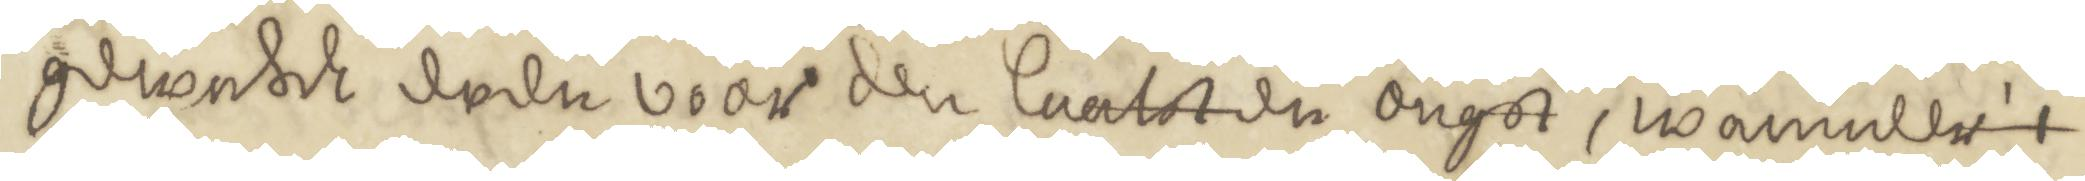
gewasch even voor den laatsten ougst, wanneer ’t
